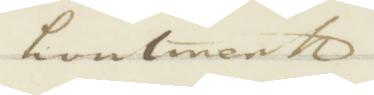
houtwerk
